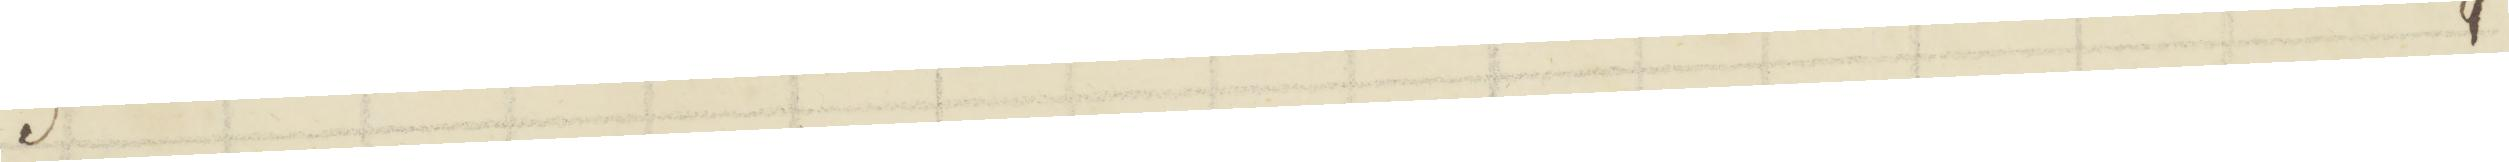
3 4
